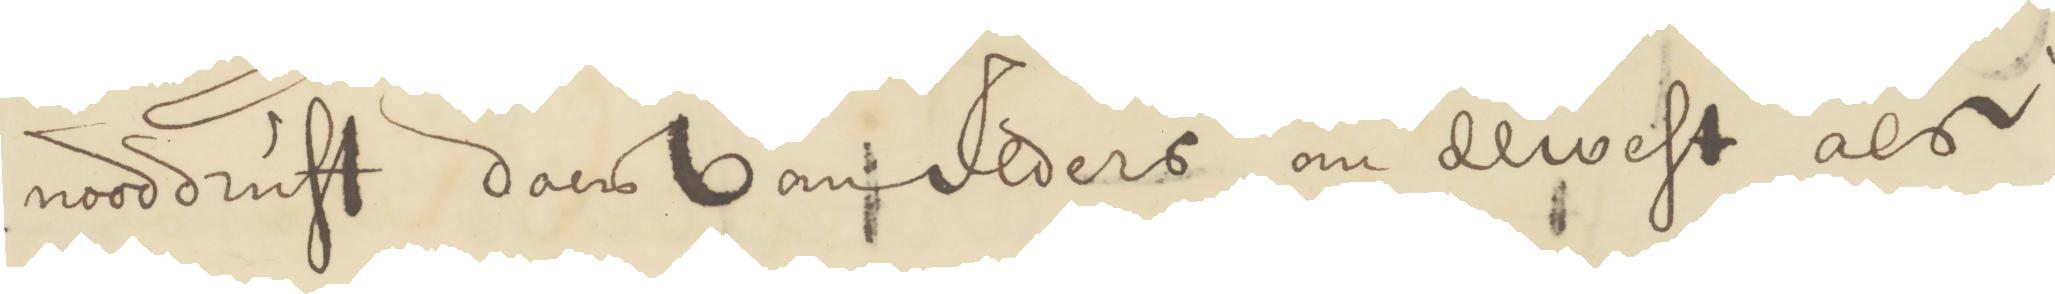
nooddrust daer van Elders om dewest als
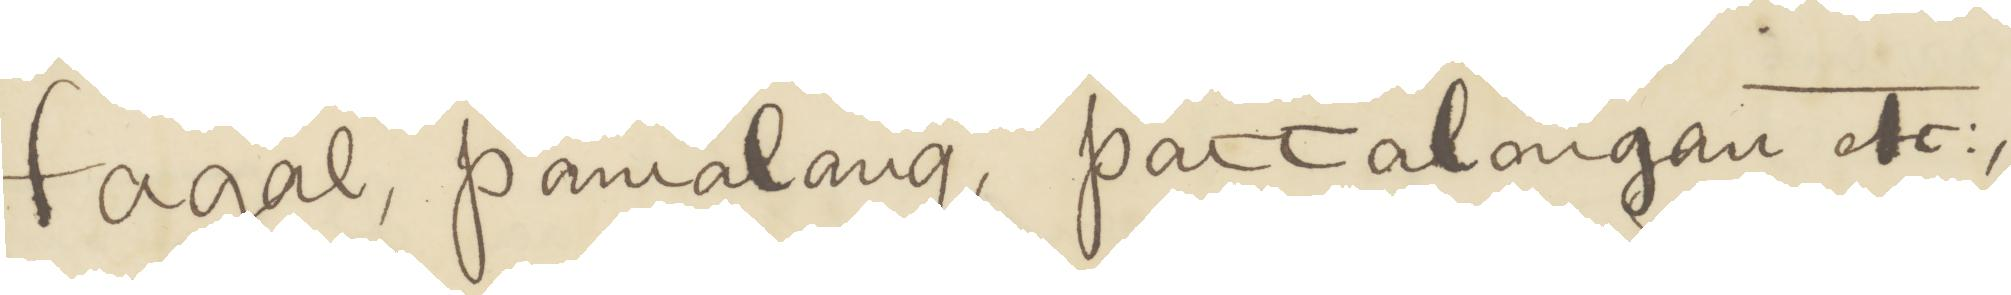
tagal, pamalang, paccalongan etc:,
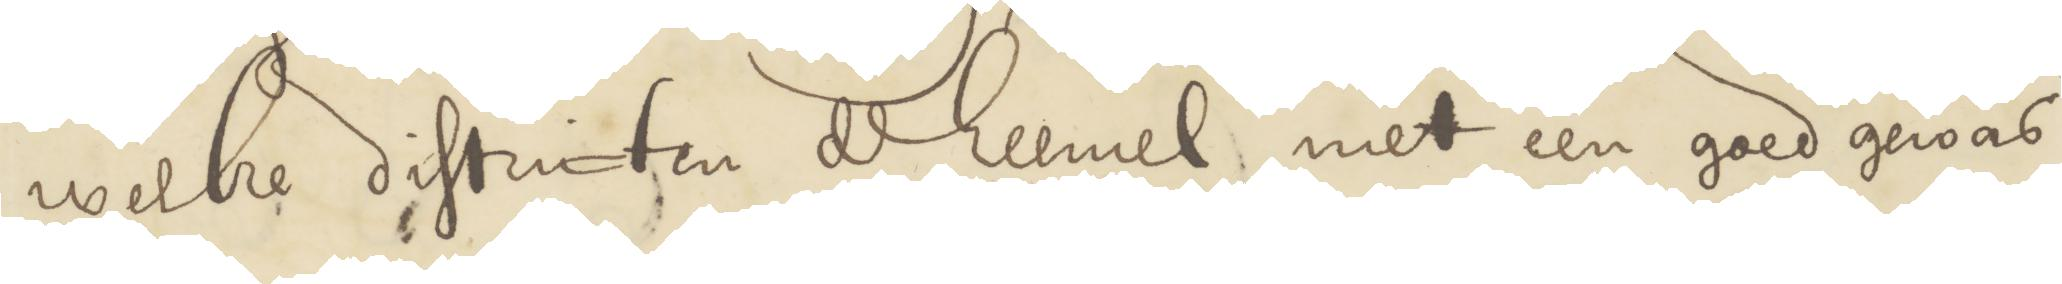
welke districten de heemel met een goed gewas
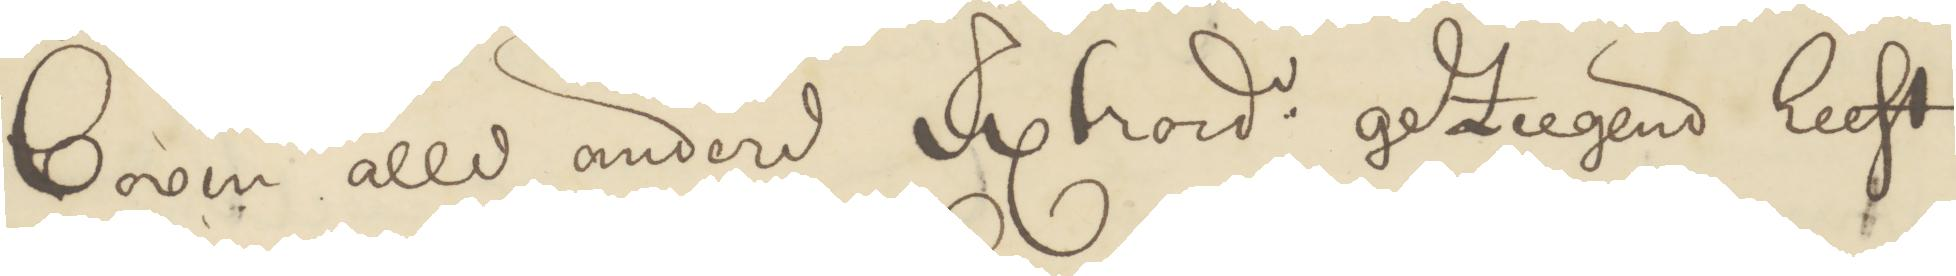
boven alle andere Extrord:e gezeegend heeft
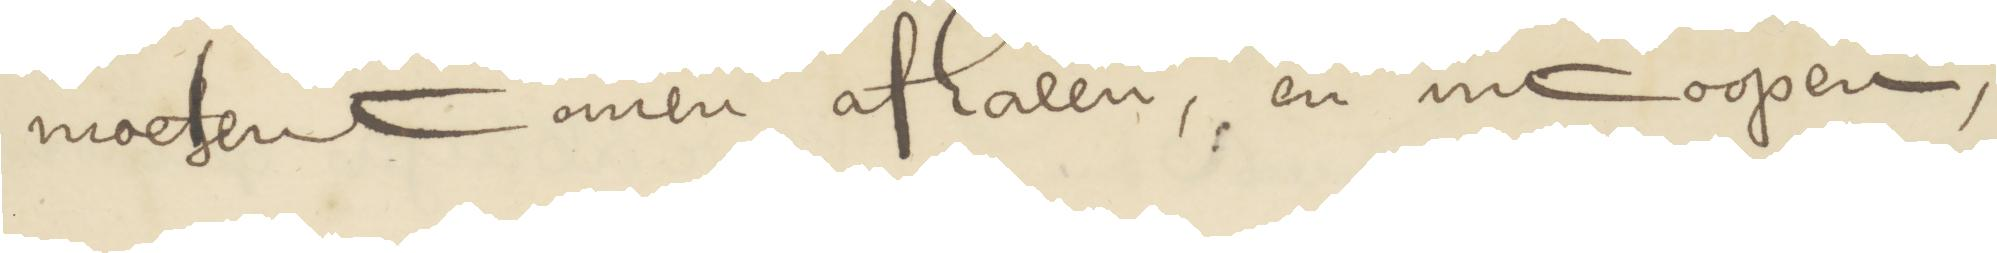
moeten comen afhalen, en incoopen,
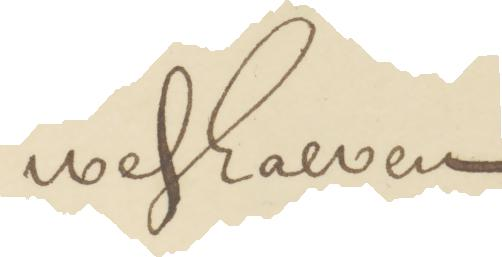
weshalven
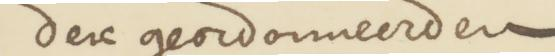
der geordonneerden
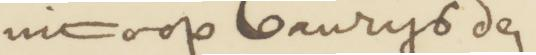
incoop van rijs den
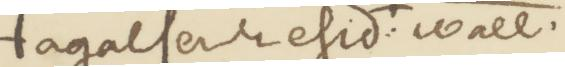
tagalse resid:t wall:
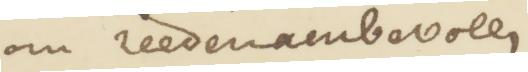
om reeden aenbevolen
